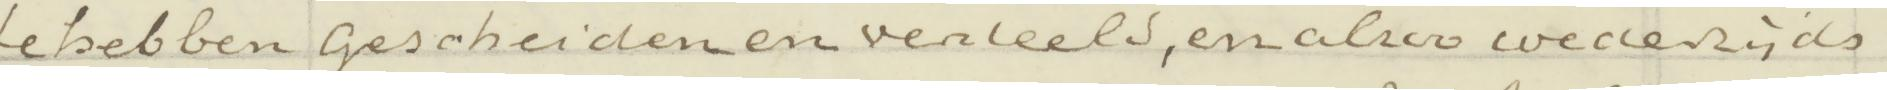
te hebben gescheiden en verdeeld, en alzoo wederzijds
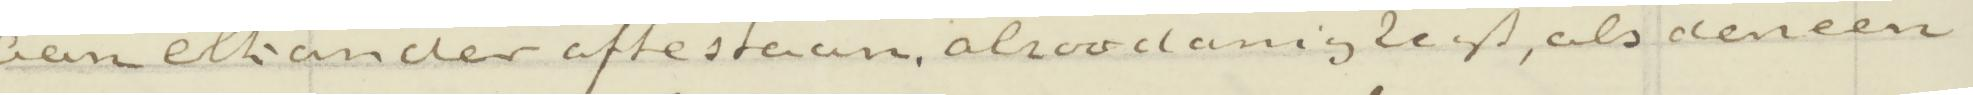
aan elkander aftestaan, alzoodanig regt, als den een
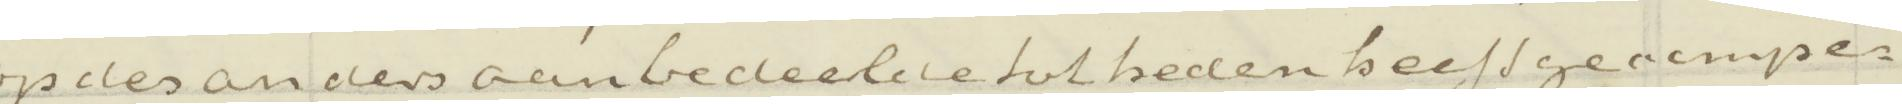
op des anders aanbedeelde tot heden heeft gecompe=
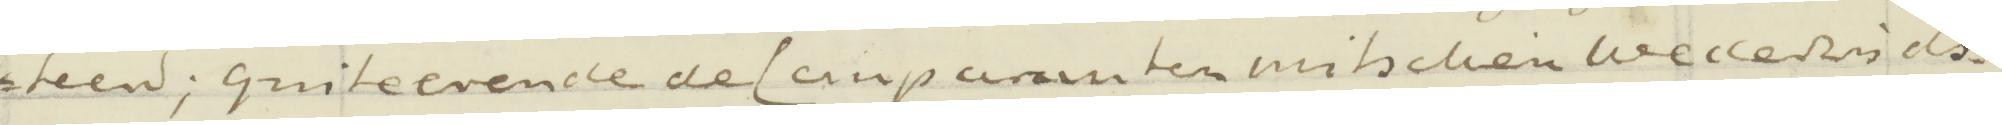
=teerd; quiteerende de Comparanten mitsdien wederzijds.
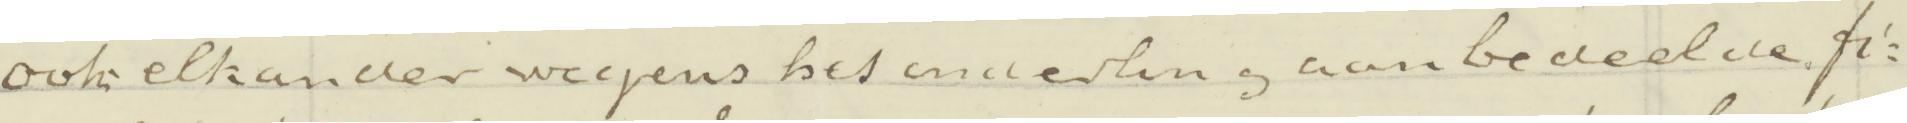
ook elkander wegens het onderling aanbedeelde fi=
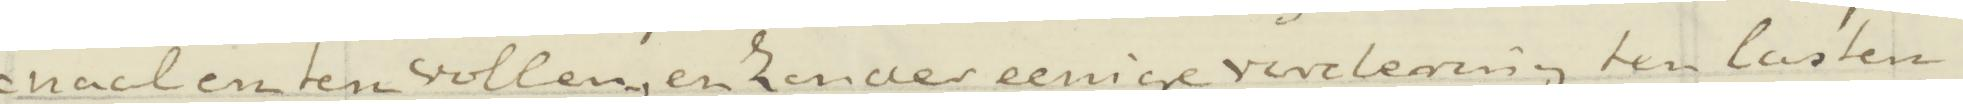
=naal en ten vollen, en zonder eenige vordering ten lasten
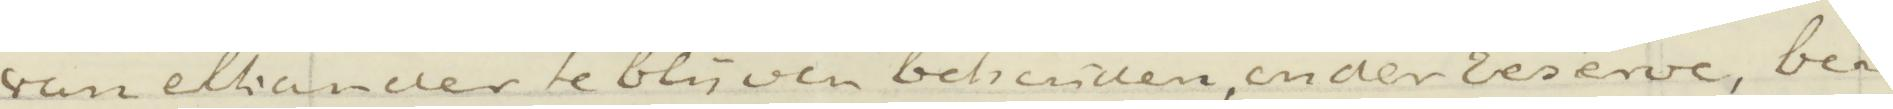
van elkander te blijven behouden, onder reserve, be=
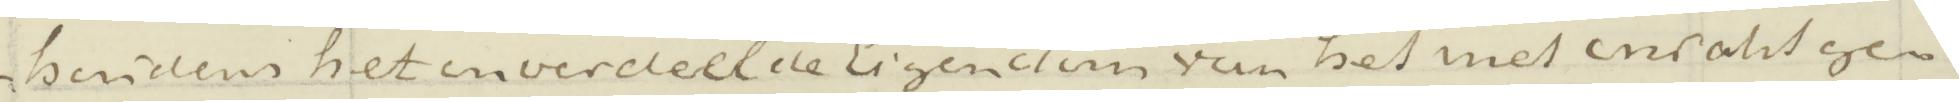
=houdens het onverdeelde Eigendom van het met onrechtge=
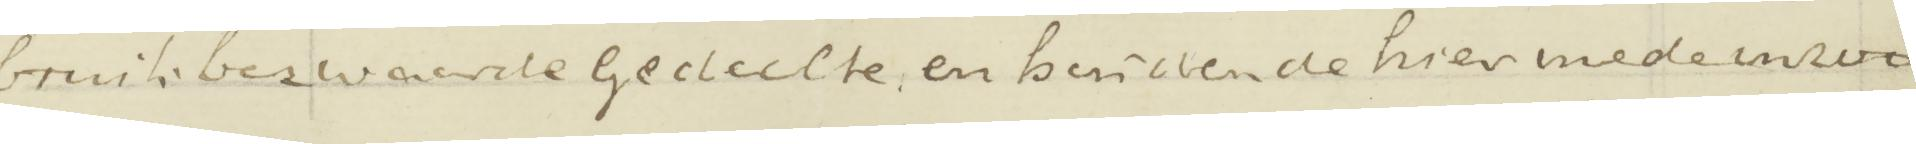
bruik bezwaarde gedeelte, en houdende hier mede inzoo
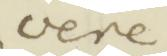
vere
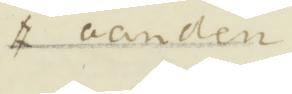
# aan den
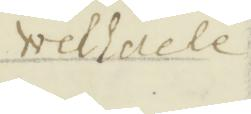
welEdele
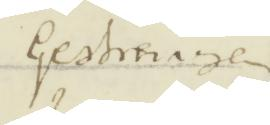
Gestrenge
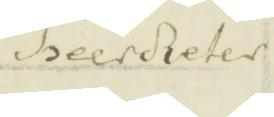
heer Pieter
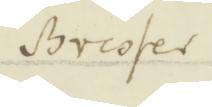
Bresser
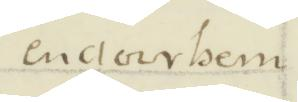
en door hem
